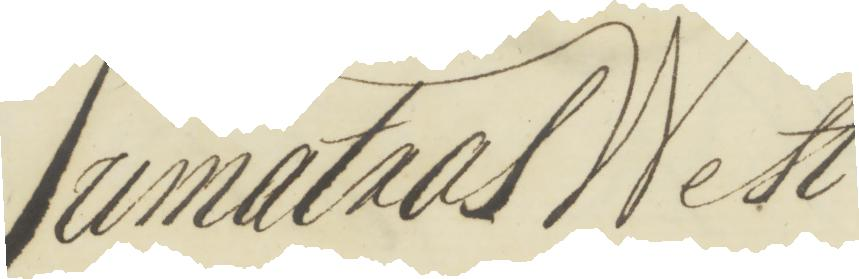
Sumatras West Cust
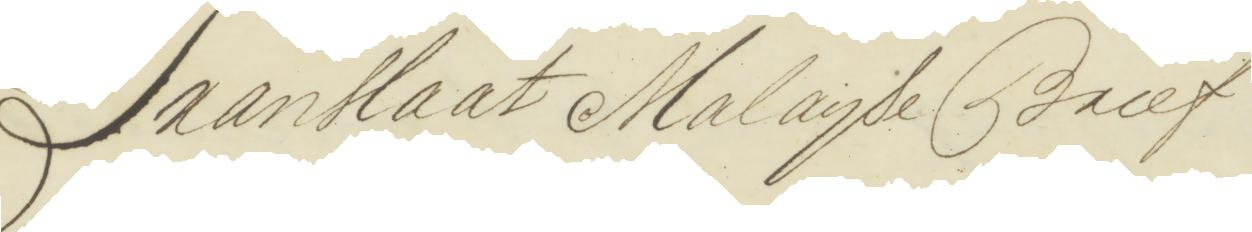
Translaat Malaijse Brief
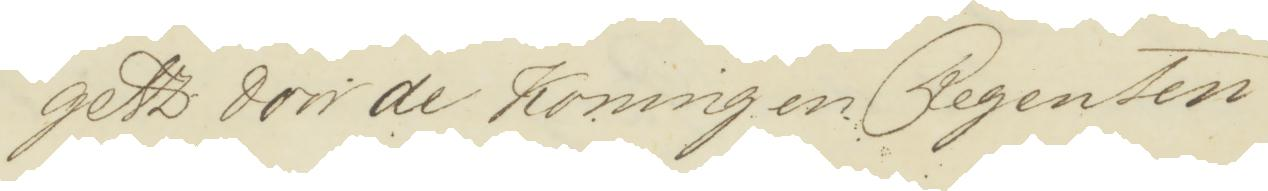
gesz door de Koning en Regenten
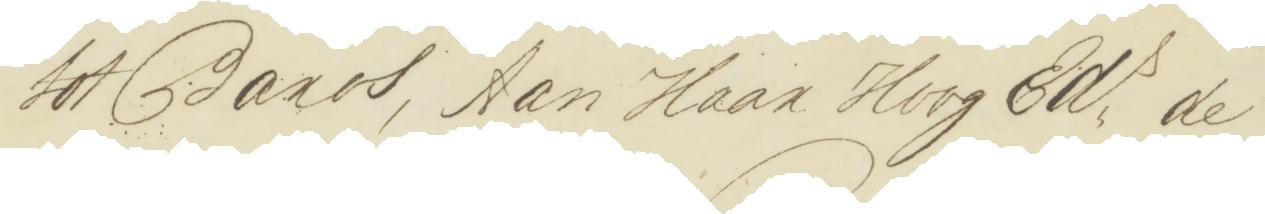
tot Baros, Aan Haar Hoog Ed„s de
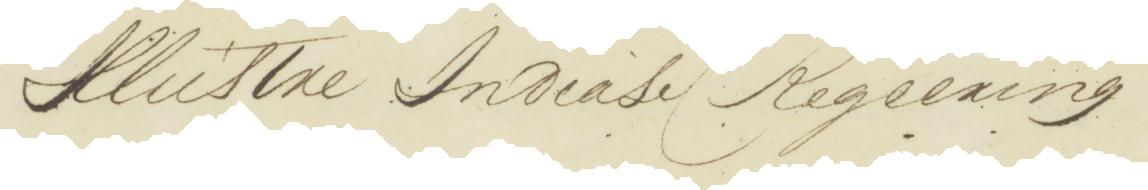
Illustre Indiase Regeering
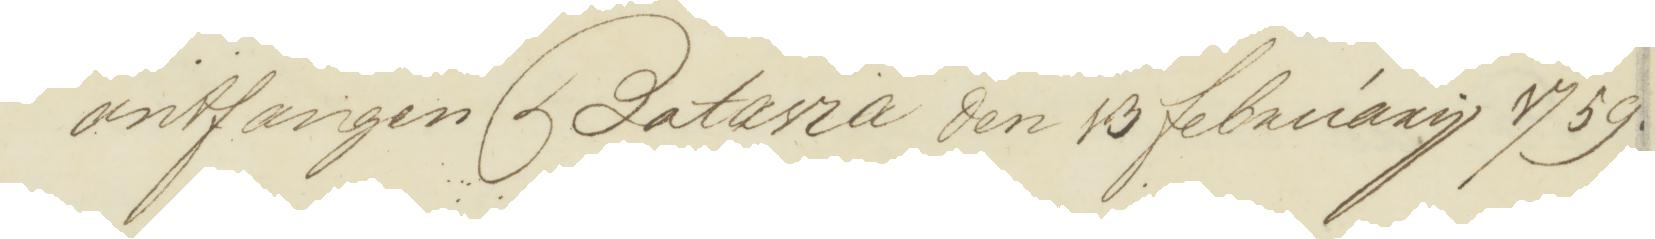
ontfangen Batavia den 13 februarij 1759
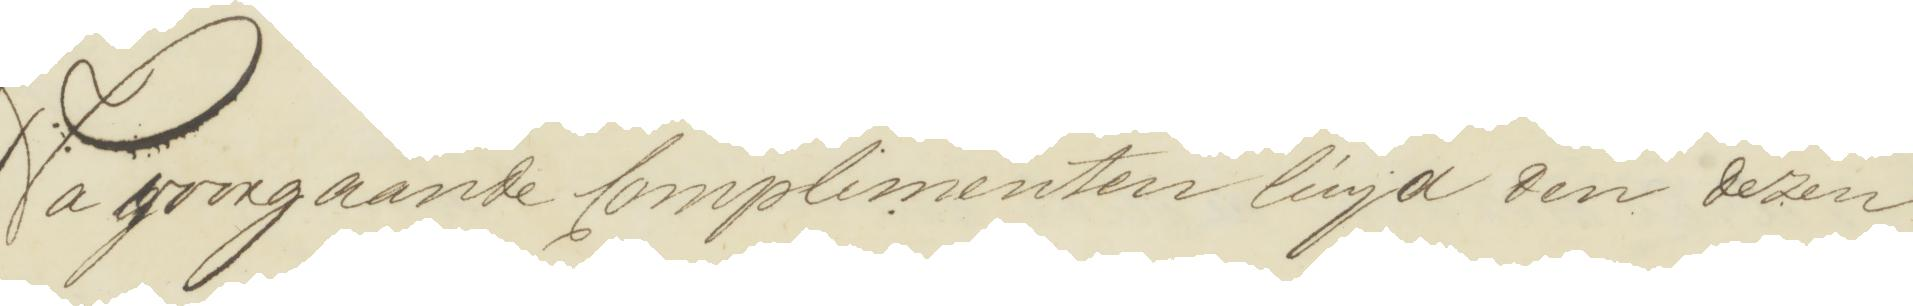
Na voorgaande Complimenten luijd den dezen
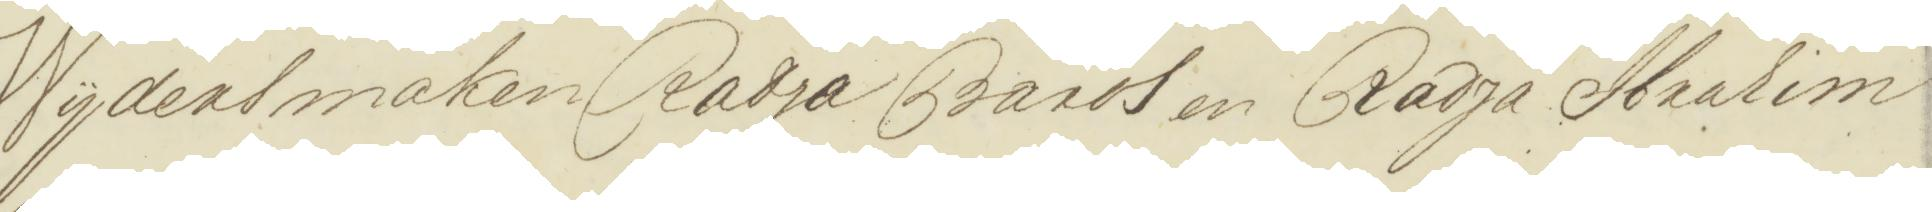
Wijders maken Radja Baros en Radja Ibrahim
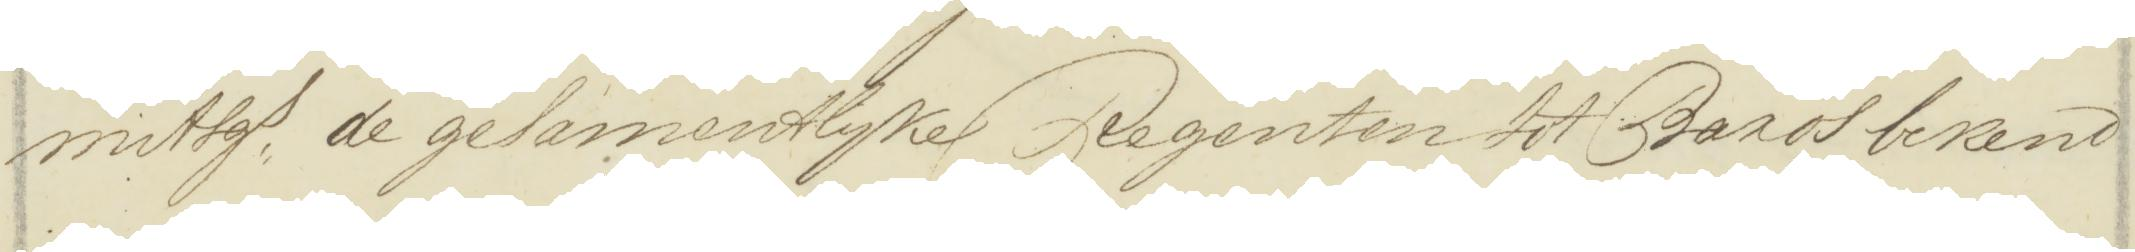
mitsg„s de gesamentlyke Regenten tot Baros bekend
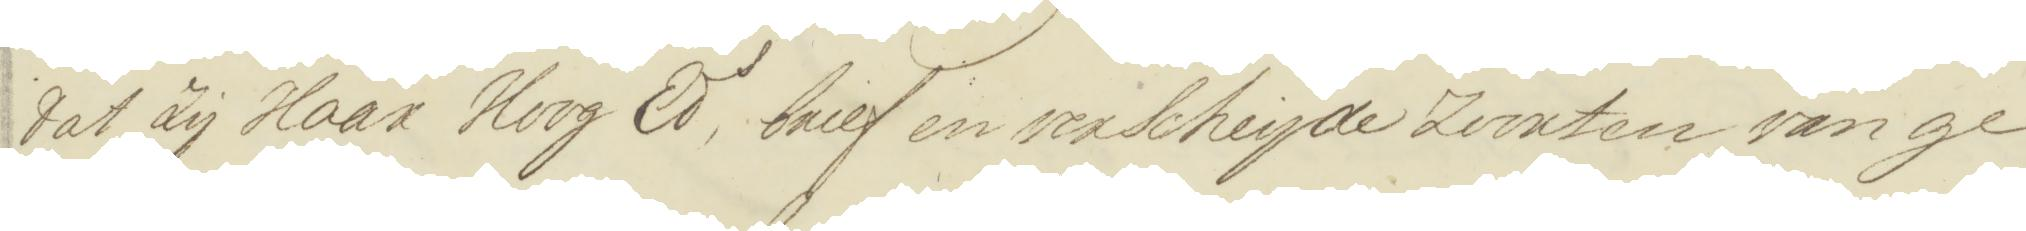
dat zij Haar Hoog Ed,s brief en verscheijde zoorten van ge
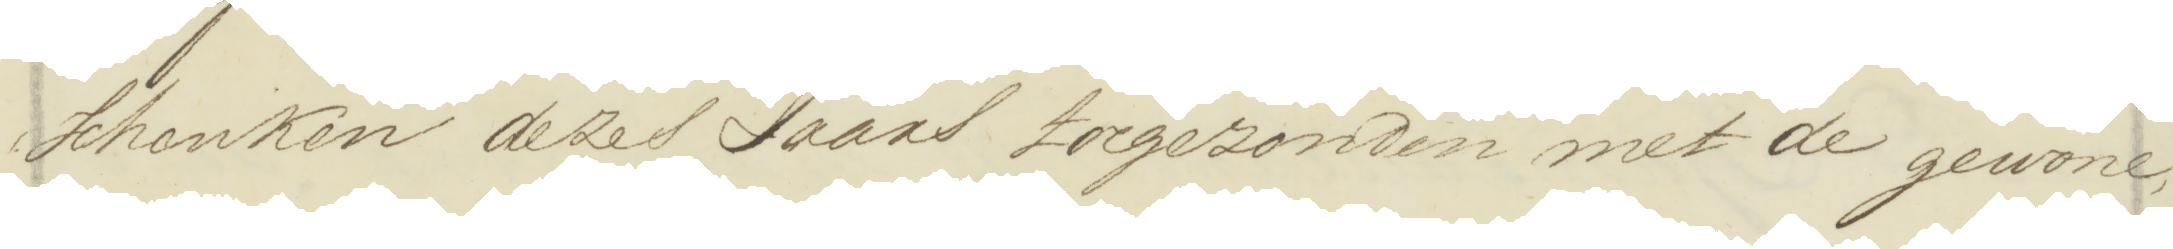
„schenken dezes Iaars toegezonden met de gewone,
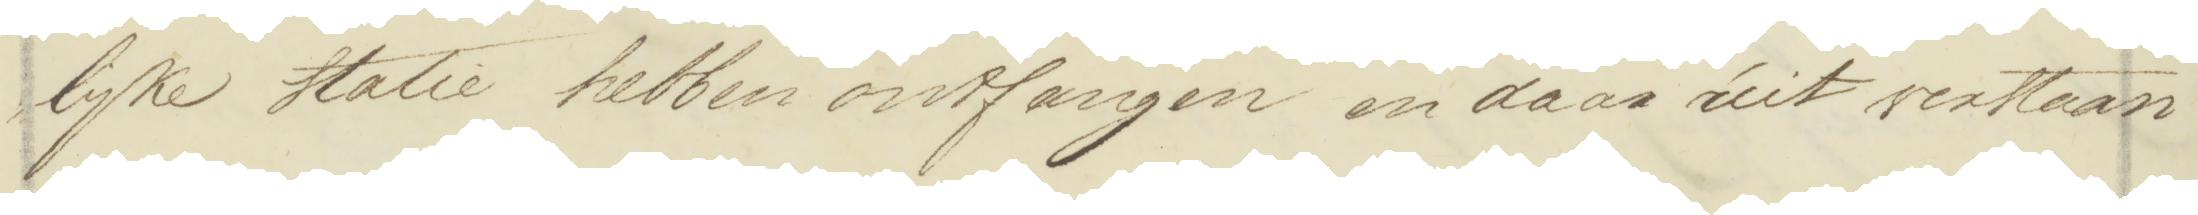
„lijke statie hebben ontfangen en daar uit verstaan
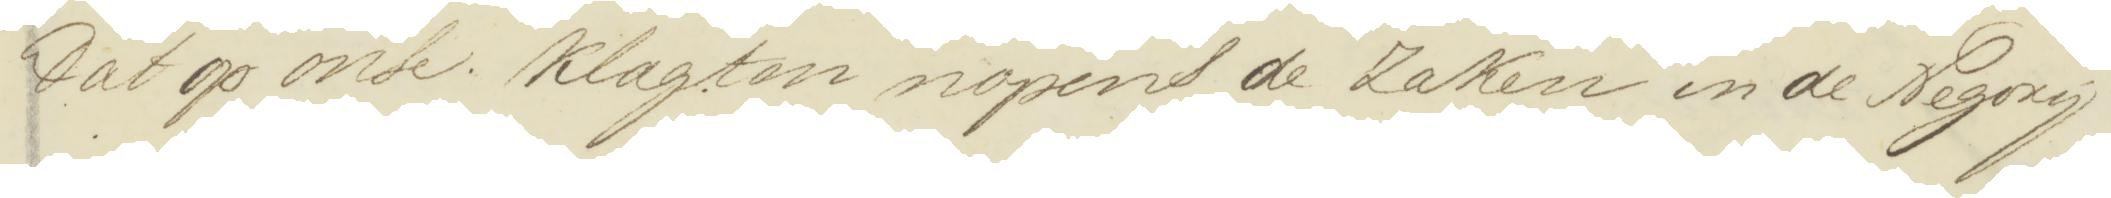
dat op onse klagten nopens de zaken in de Negorij
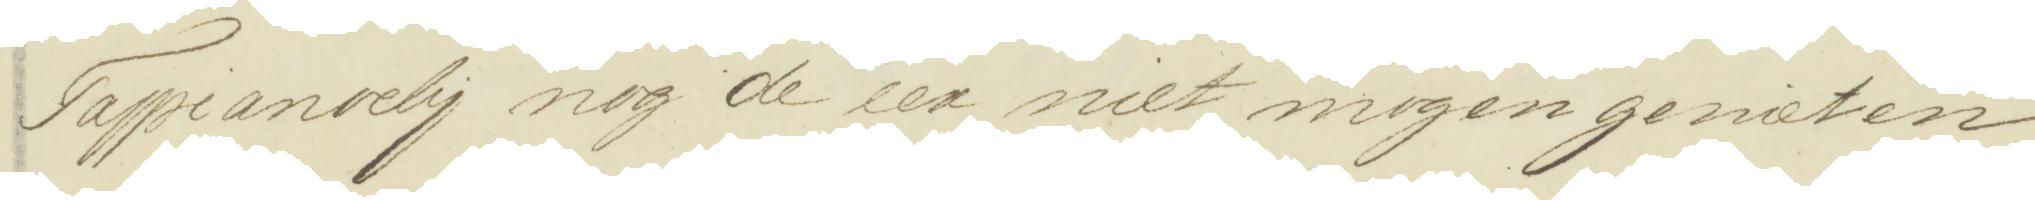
Tappianoelij nog de eer niet mogen genieten
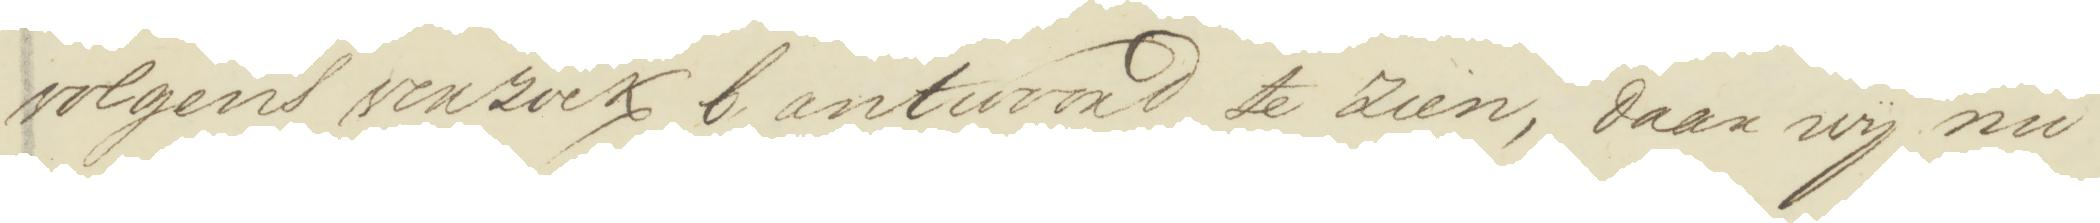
volgens verzoek b,antwoord te zien, daar wij nu
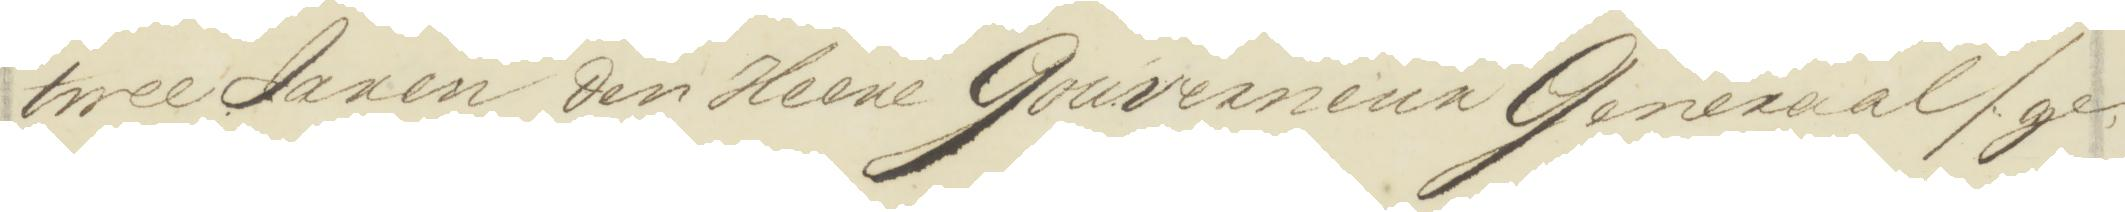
twee Iaren den Heere Gouverneur Generaal /:ge,
